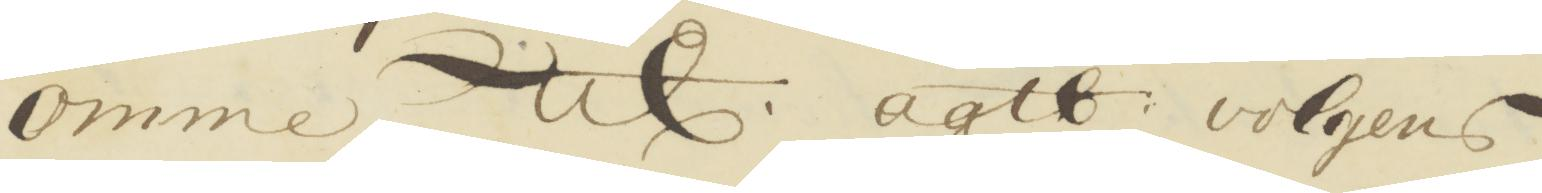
omme UE: agtb: volgens
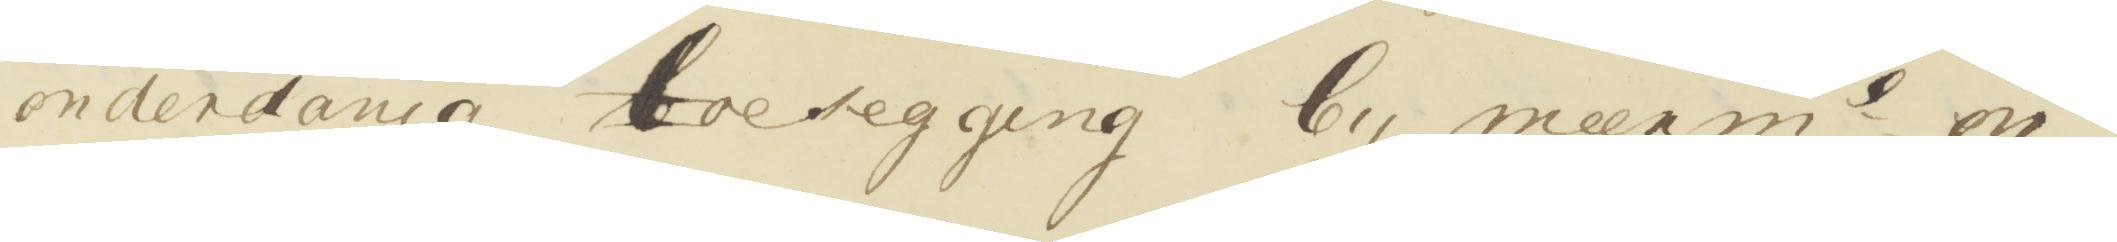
onderdanig toesegging by meerm=s on
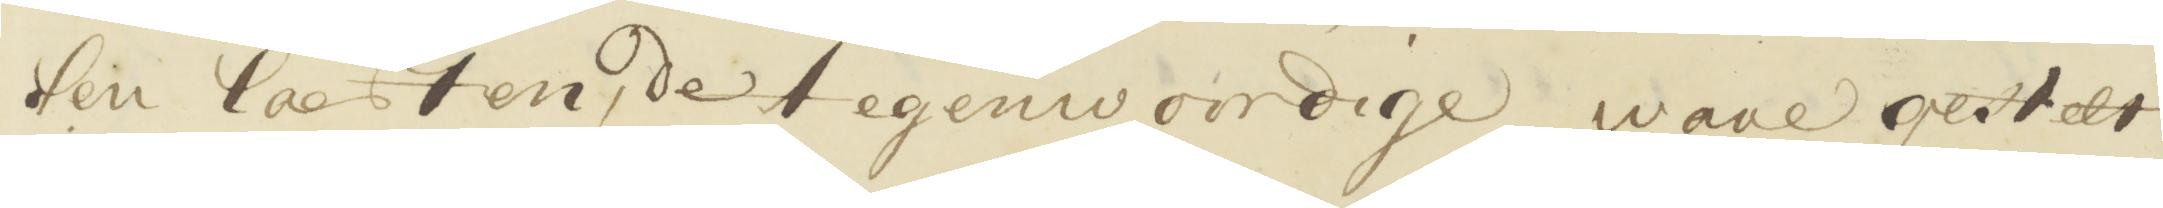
sen laesten, de tegenwoordige ware gestelt
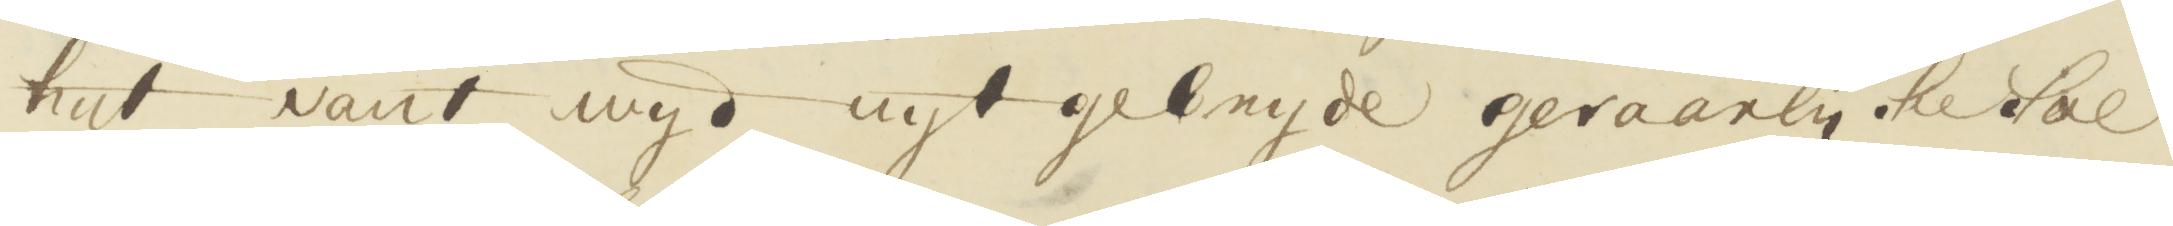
hyt vant wyd uyt gebryde gevaarlycke Sal
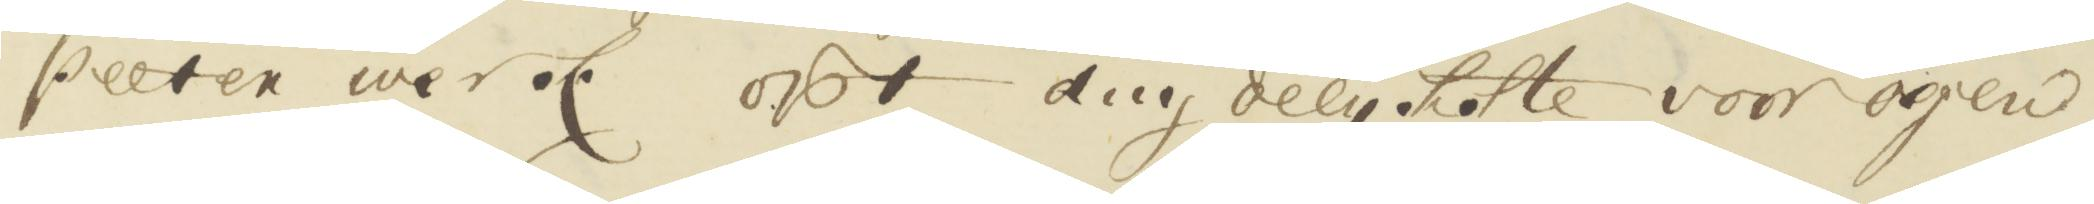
peeter werk opt duydelykste voor ogen
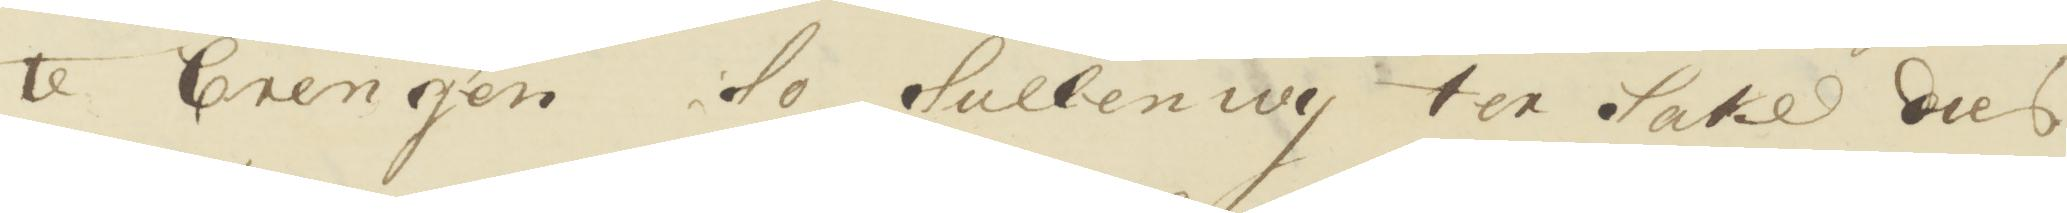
te brengen So sullen wy ter sake dies
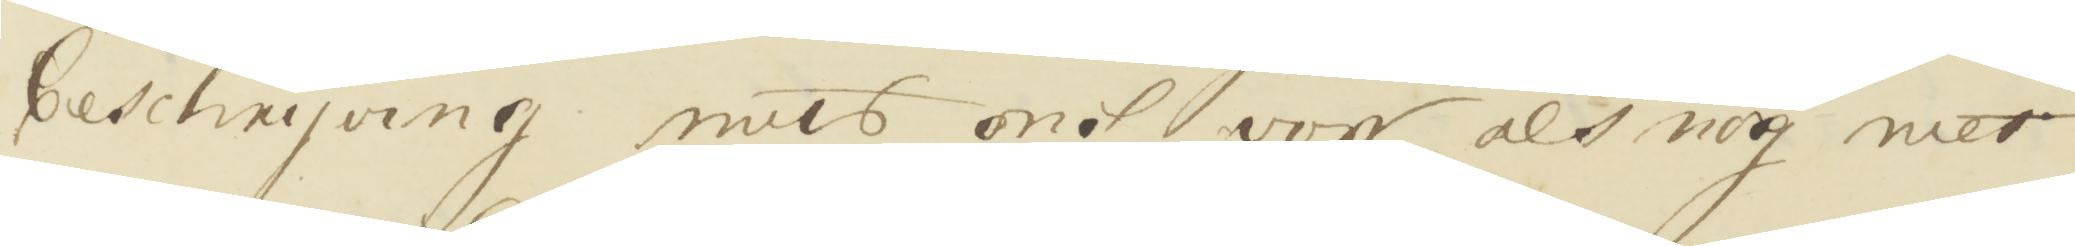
beschryving mits ons voor als nog niet
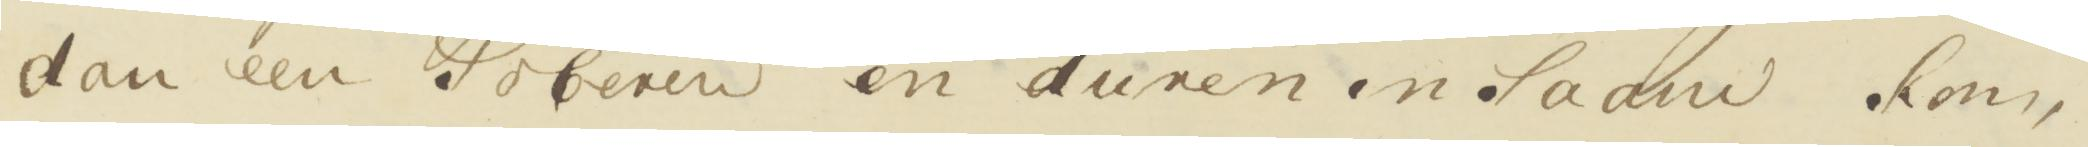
dan een Soberen en duren in Saam kon„
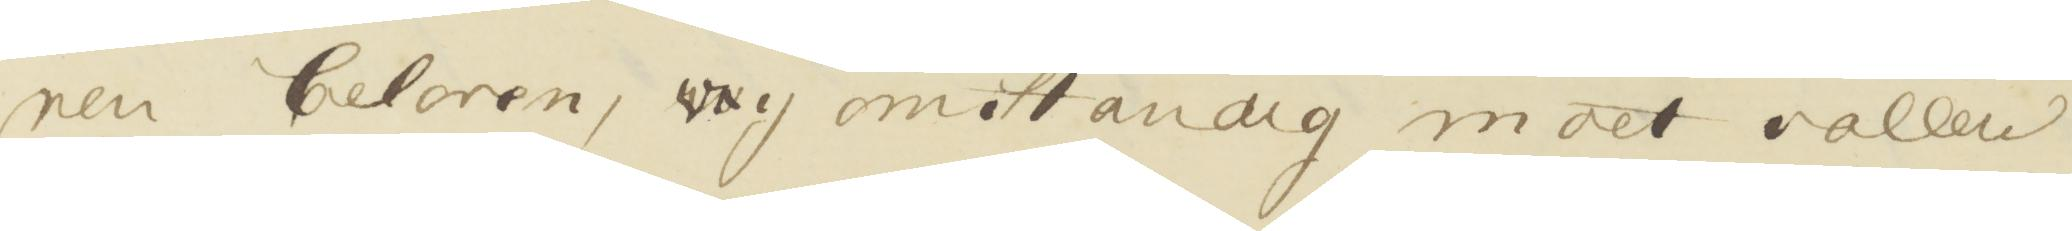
nen beloven, vry omstandig moet vallen
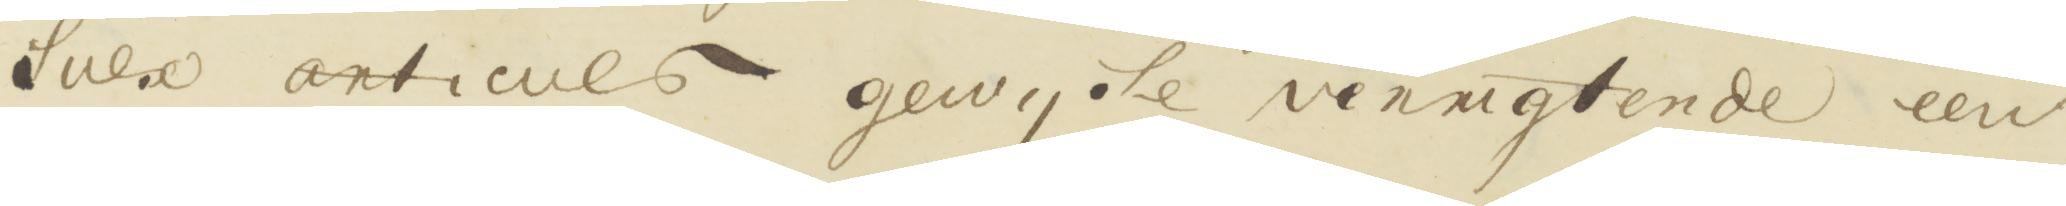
Sulx articuls gewyse verrigtende een
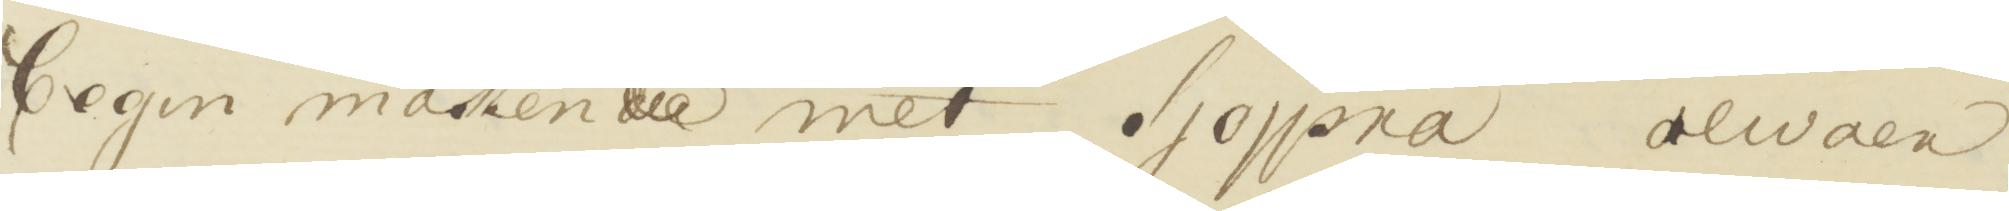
begin makende met Sjoppra alwaer
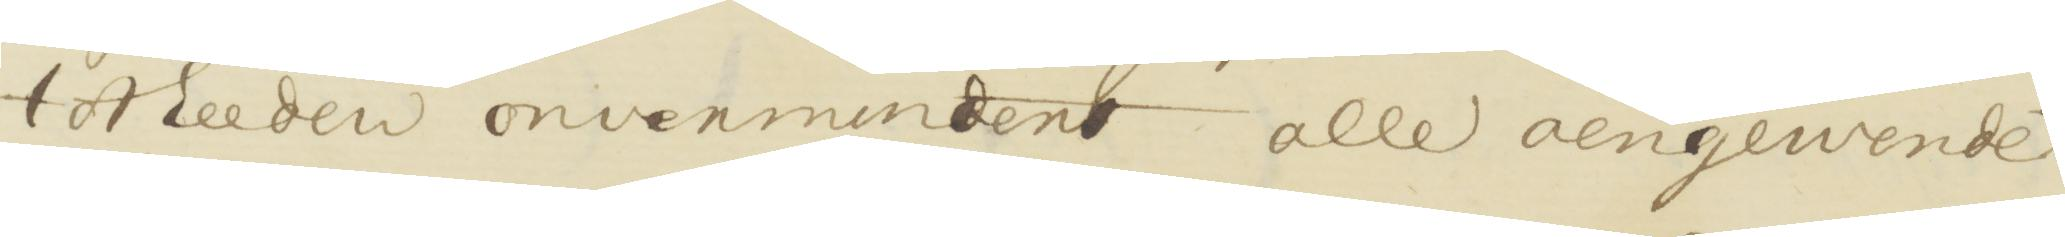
tot heeden onvermindert alle aengewende
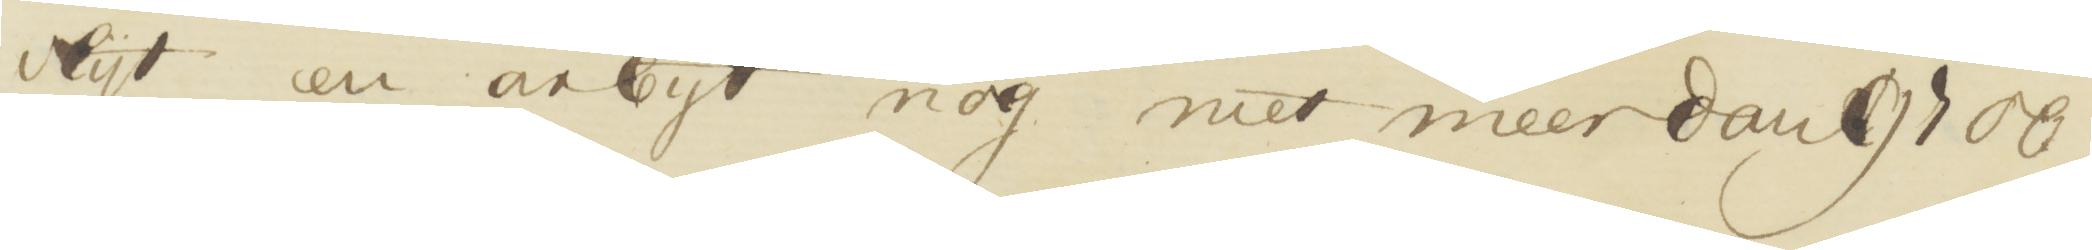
vlijt en arbyt nog niet meer dan 9100
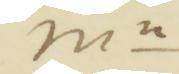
m=n
